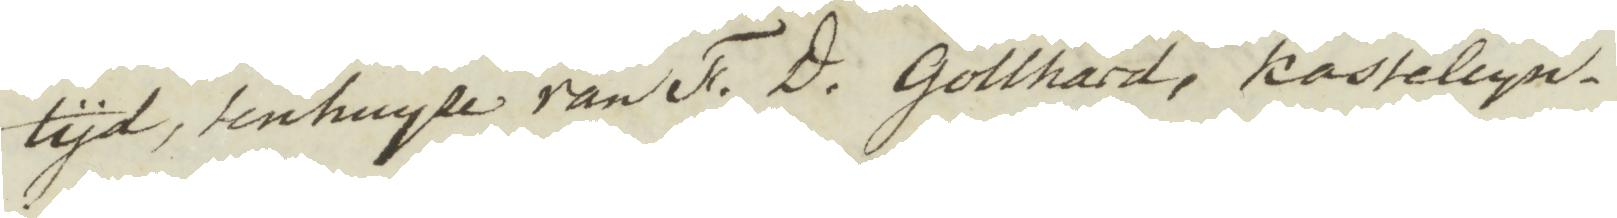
tijd, tenhuyze van F: D. Gotthard, kasteleyn.
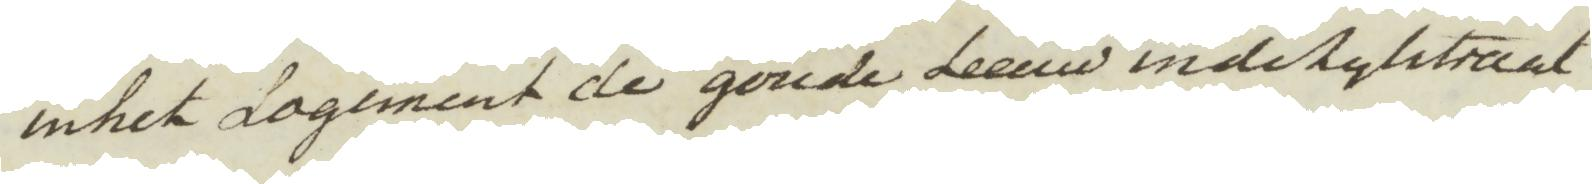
in het Logement de goude Leeuw in de Zylstraat
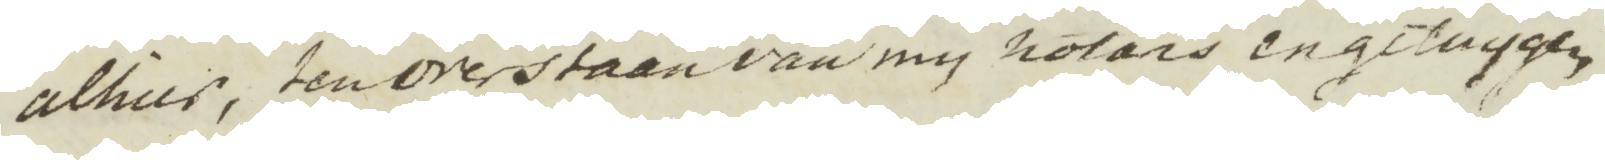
alhier, ten overstaan van my notaris en getuijgen
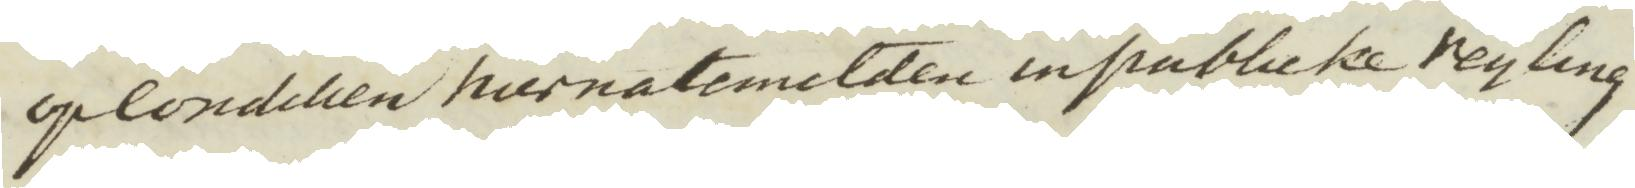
op conditien hiernatemelden inpublieke veyling
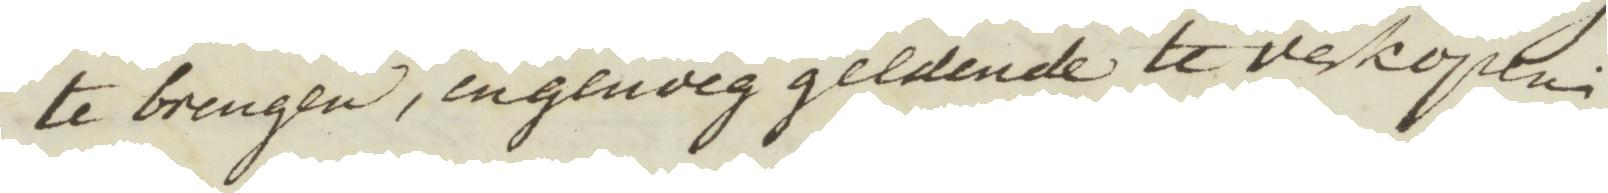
te brengen, engenoeg geldende te verkopen:
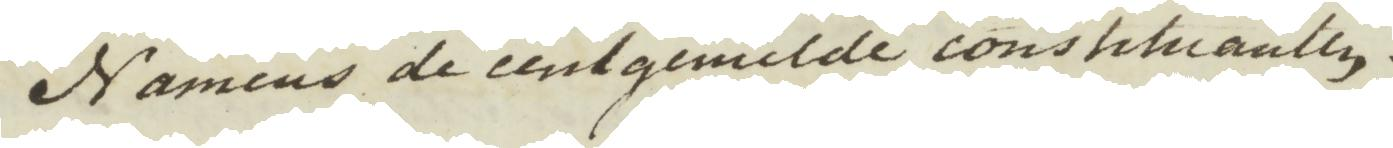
Namens de eerstgemelde constituanten.
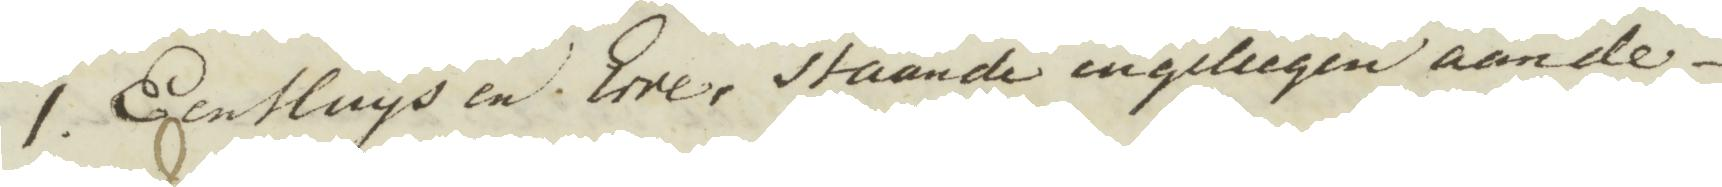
1: Een Huys en Erve, staande en geleegen aan de -
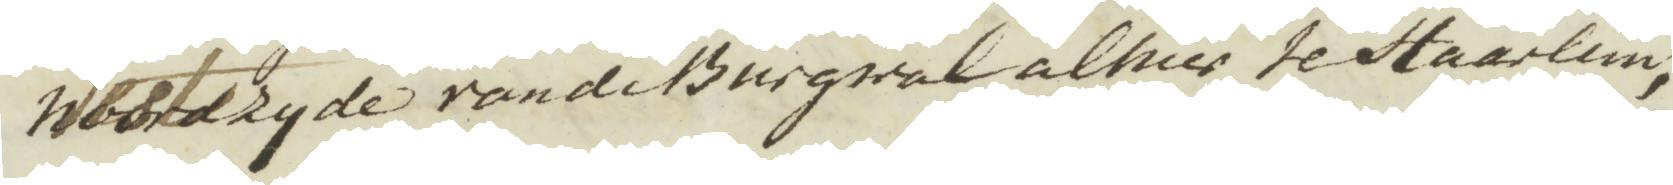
Westzyde van de Burgwal alhier te Haarlem,
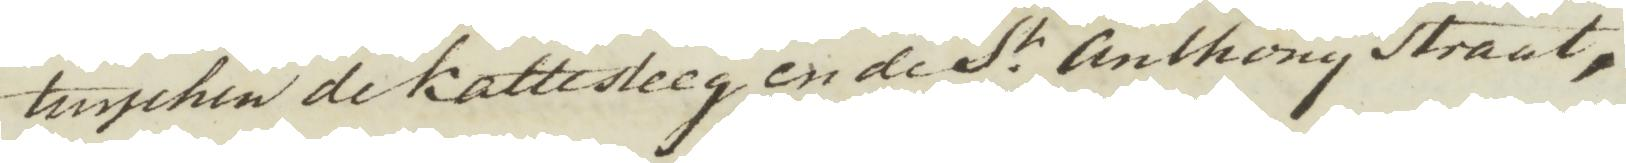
tusschen de kattesteeg en de S.t Anthony straat,
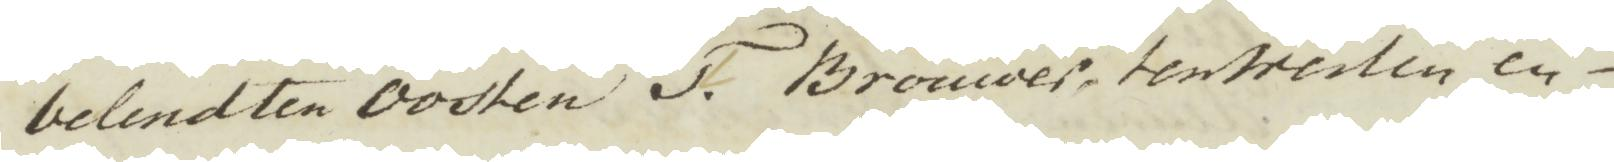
belend ten Oosten T: Brouwer, ten westen en -
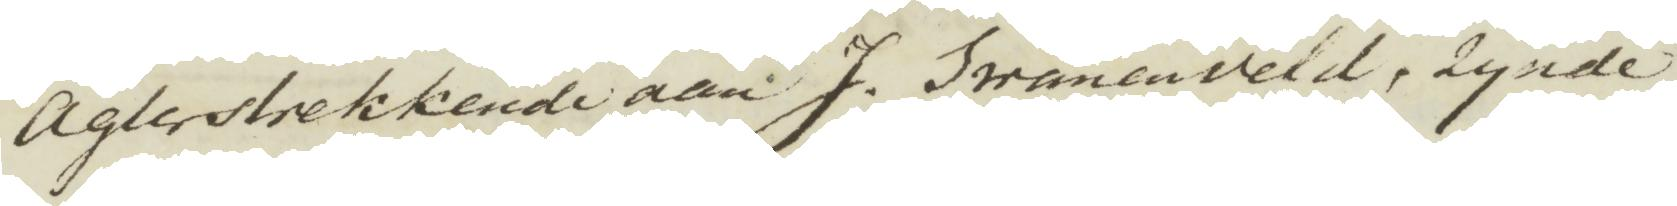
Agterstrekkende aan J. Swanenveld, zynde
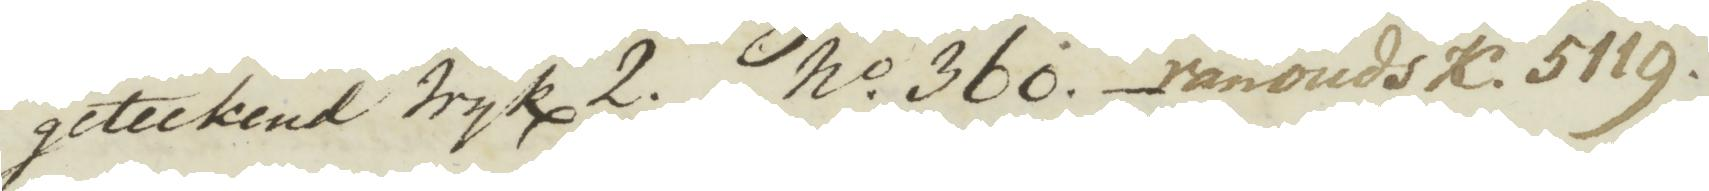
geteekend Wyk 2 N.o 360. —van ouds K. 5119.
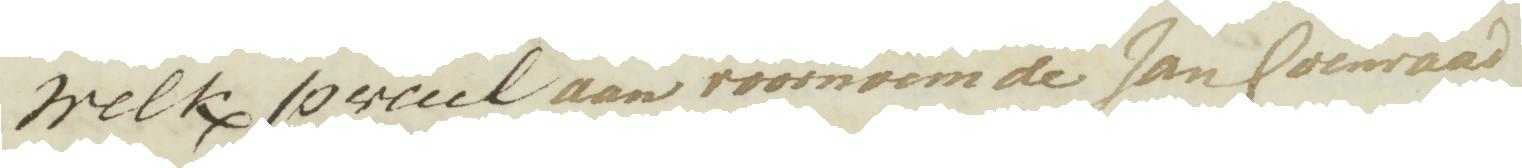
welk perceel aan voornoemde Jan Coenraad
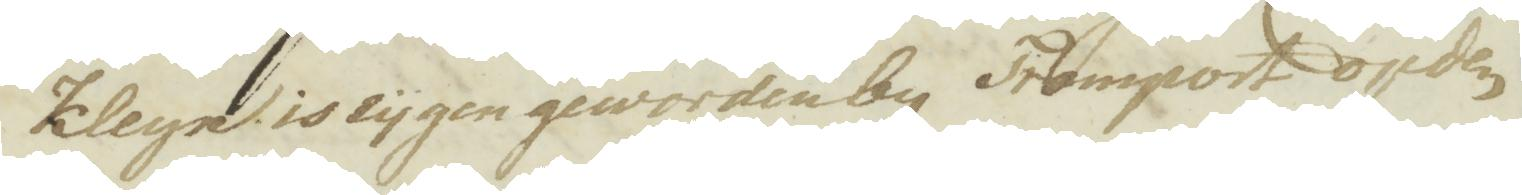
Kleyn is eijgen geworden by Transport op den
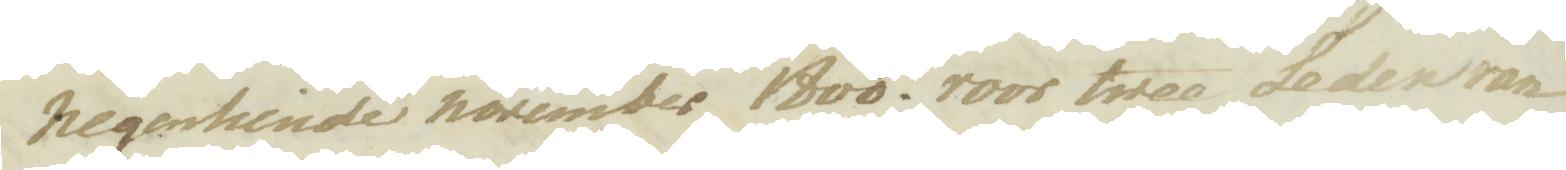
negentiende november 1800. voor twee Leden van
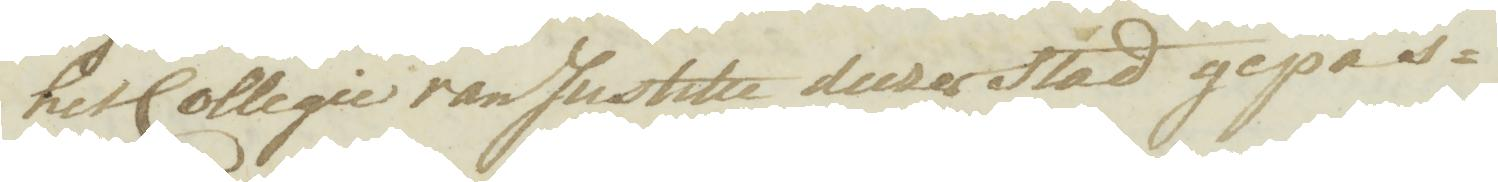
het Collegie van Justitie deezer Stad gepas=
